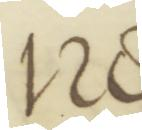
128:
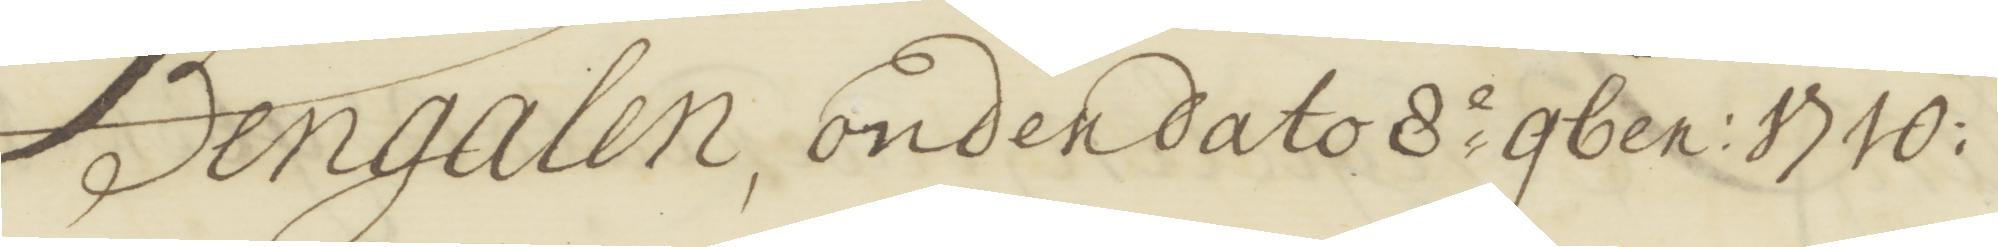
Van Bengalen, onder dato 8„e 9ber: 1710:
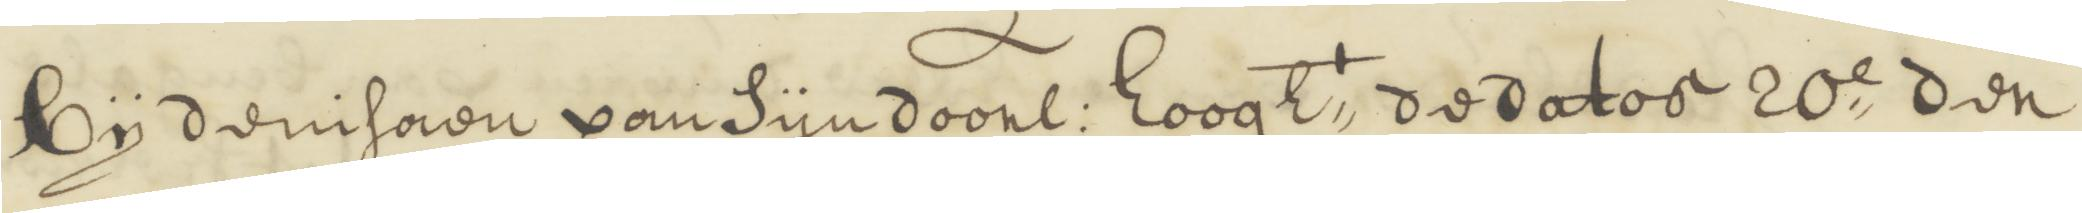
Bij denisaen van sijn doorl: hoogh„t de datos 20„e der
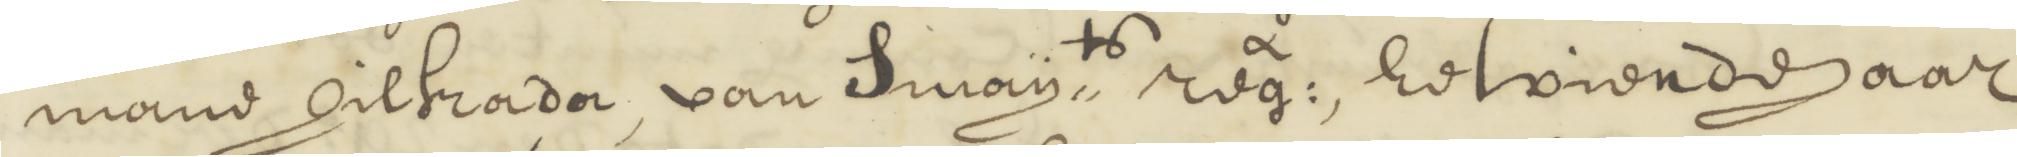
mane jilkada van smaij„ts reg:, het vierde jaar
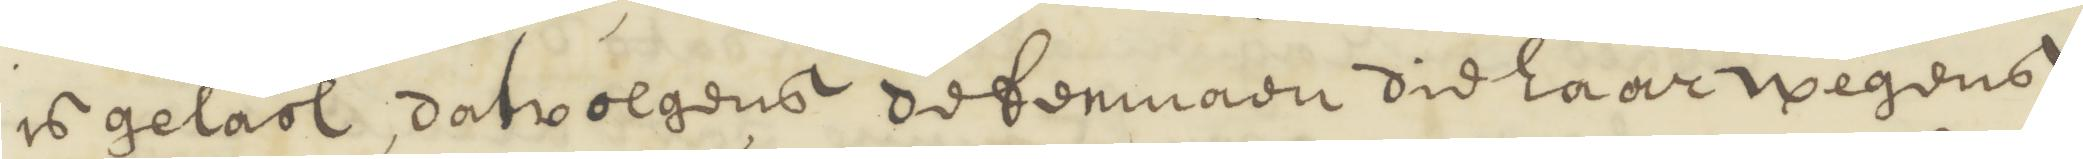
is gelast, dat volgens defermaen die haar wegens
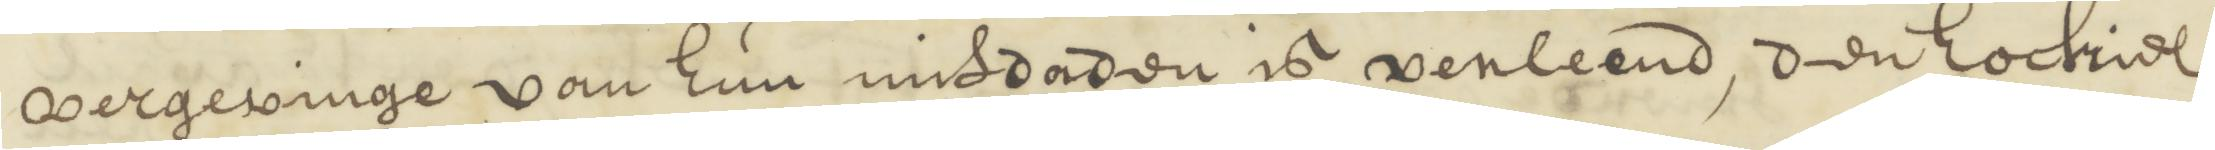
vergevinge van hun misdaden is verleend, den hockiel
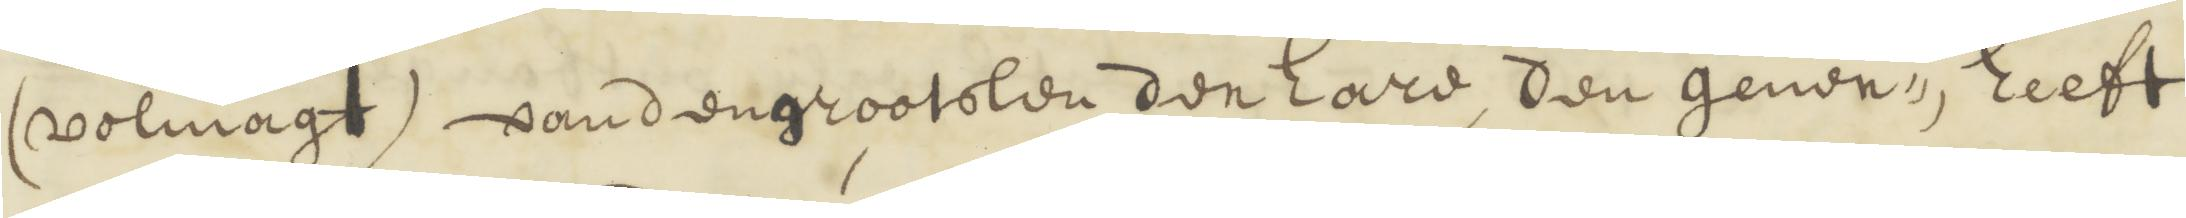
(volmagt) van den grootsten der hare, den gener„l, heeft
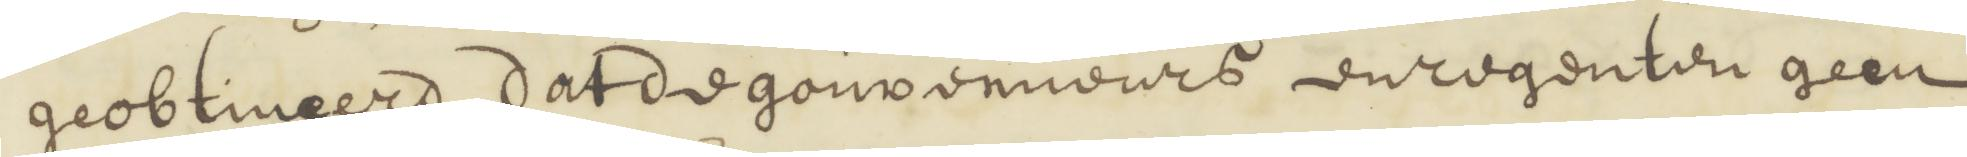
geobtineerd, dat de gouverneurs en regenten geen
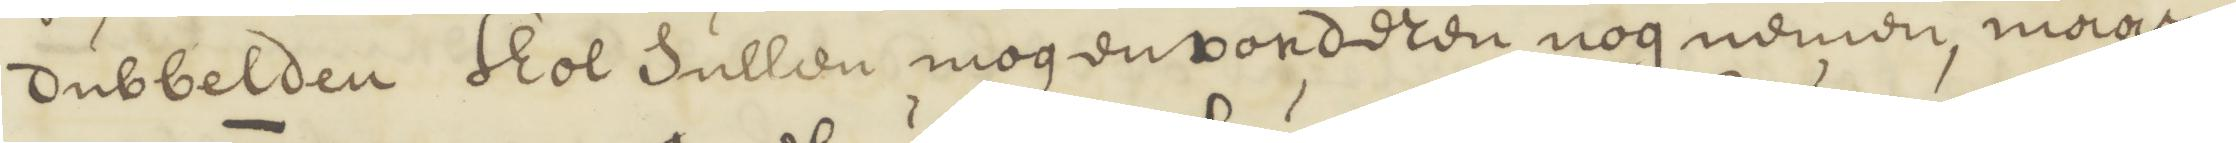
dubbelden thol sullen mogen vorderen nog nemen, maar
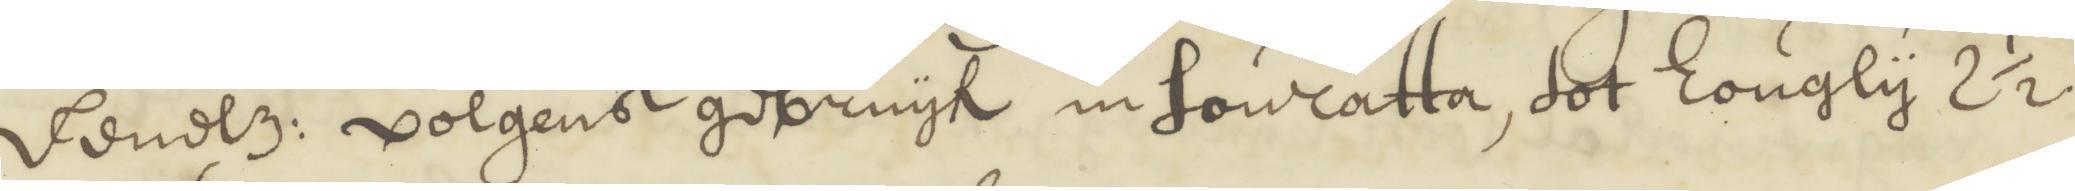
Eenelijk volgens gebruijk in souratta, tot houglij 2½
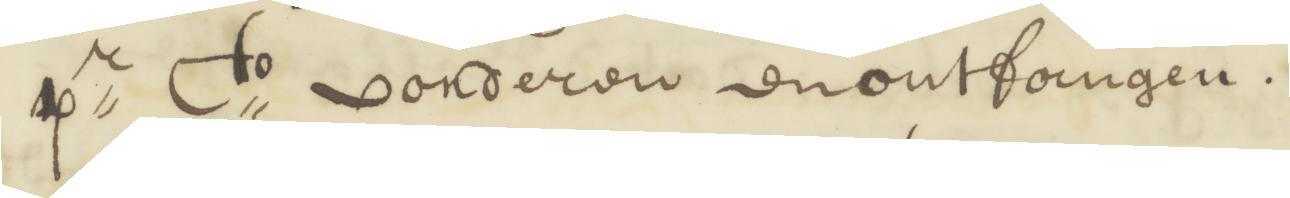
p„r C„to vorderen en ontfangen.
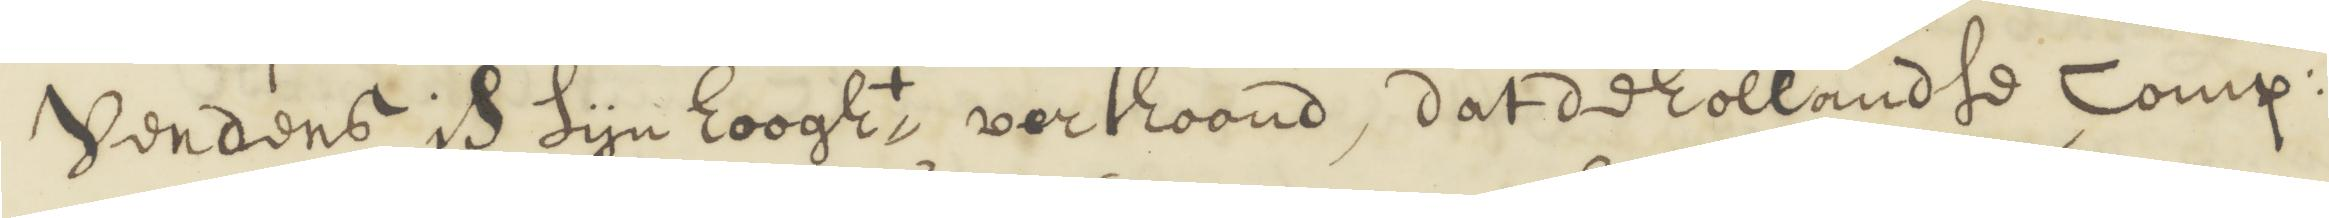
Verders is sijn hoogh„t verthoond, dat de hollandse Comp:
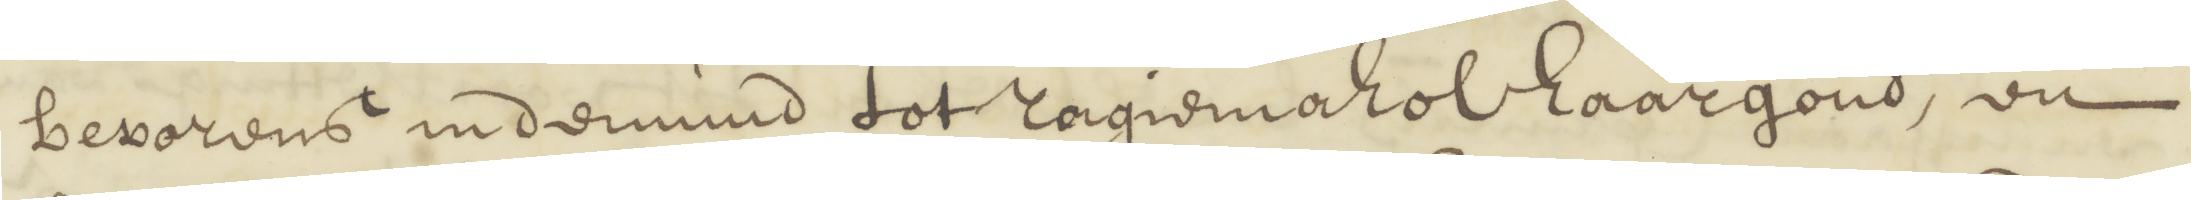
bevorens in demund tot ragiemahol haar goud, en
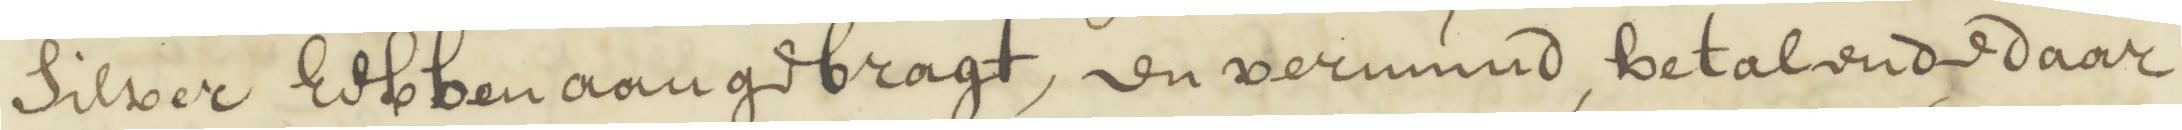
silver hebben aangebragt, en vermund, betalende daar
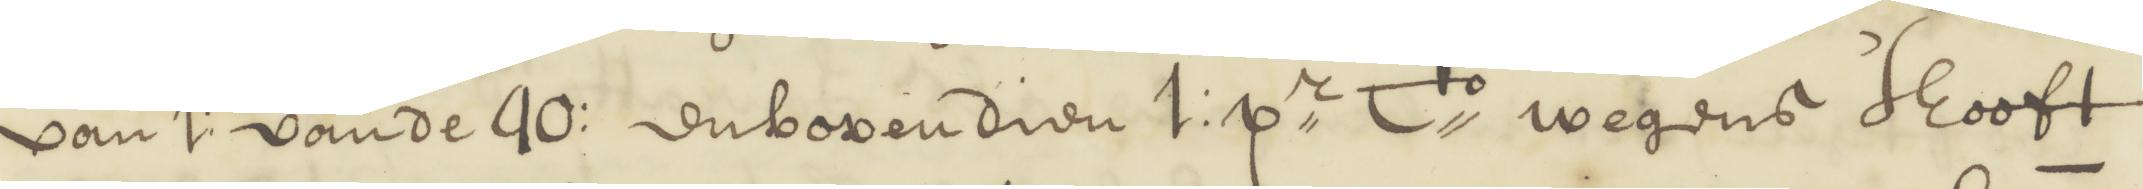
van 1: van de 40: en boven dien 1: p„r C„to wegens 'thooft
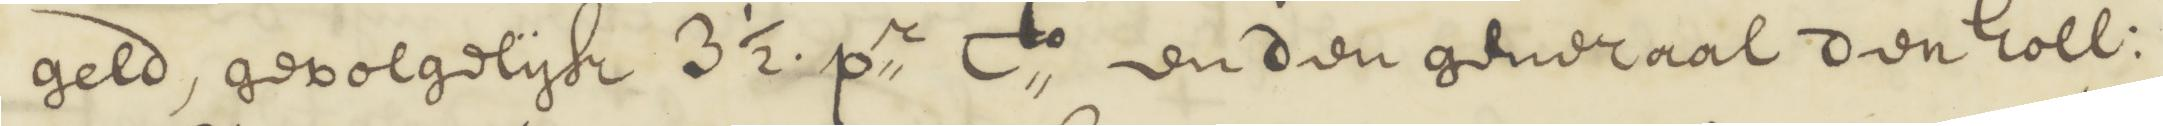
geld, gevolgelijk 3½: p„r C„to en den generaal den holl:
